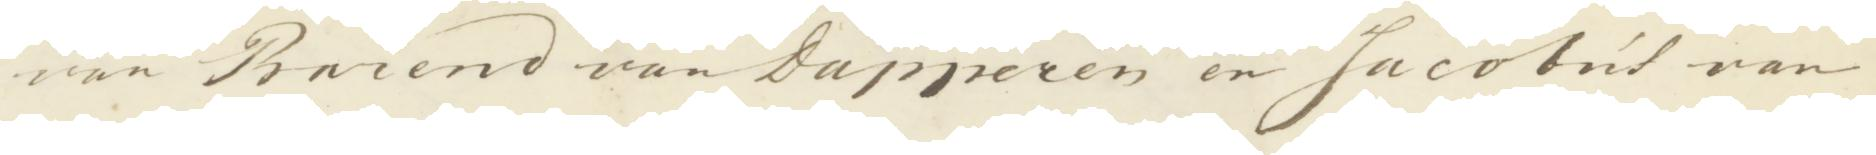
van Barend van Dapperen en Jacobus van
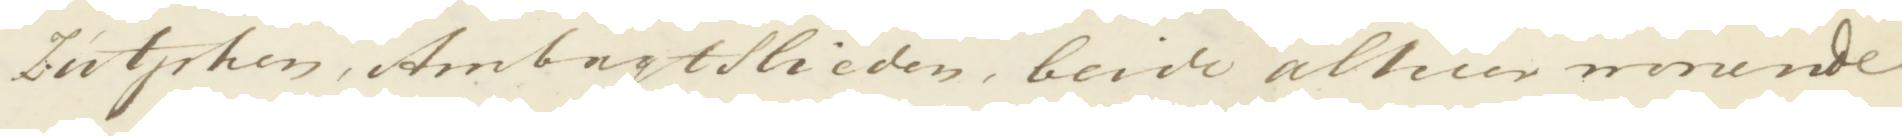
Zutphen, Ambagtslieden, beide alhier wonende
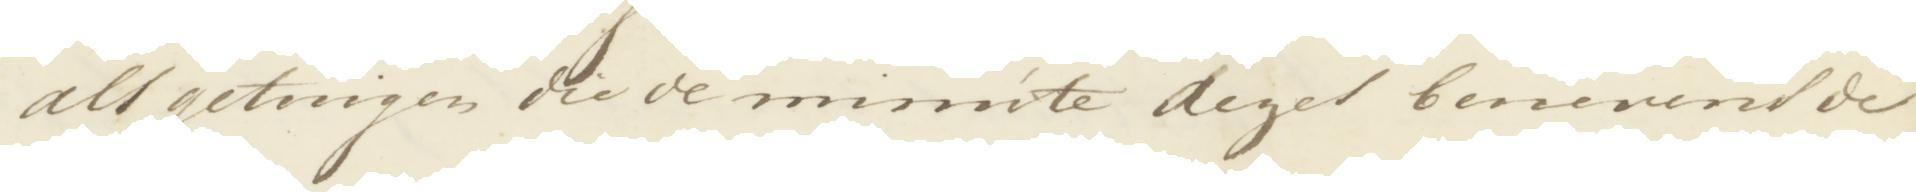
als getuigen die de minute dezes benevens de
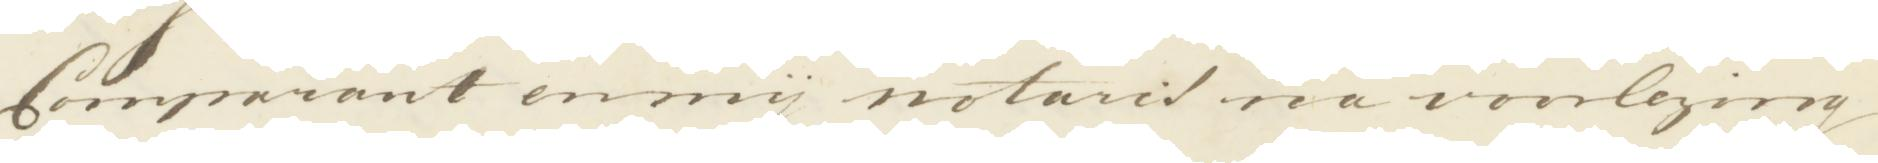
Comparant en mij notaris na voorlezing
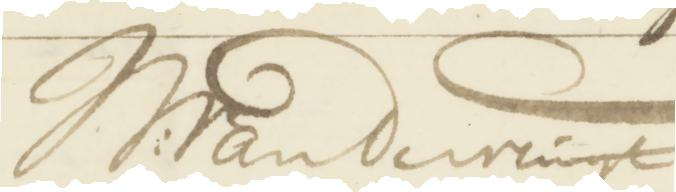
N: Van de vlugt
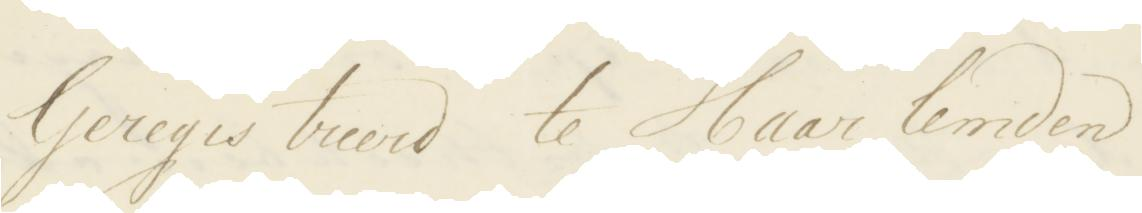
Geregistreerd te Haar lem den
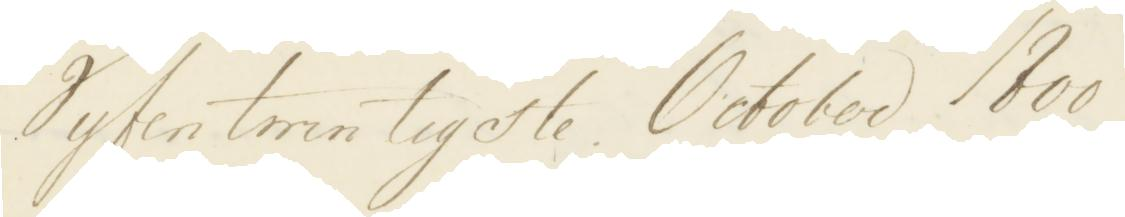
Vyfen twintigste, October 1800
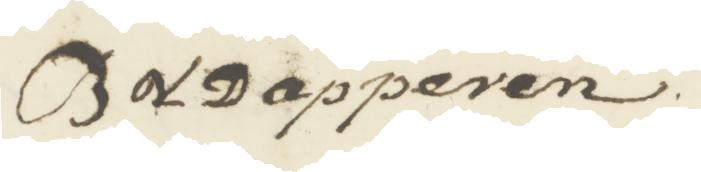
B v Dapperen.
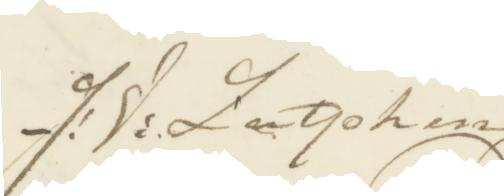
-J: V: Zutphen
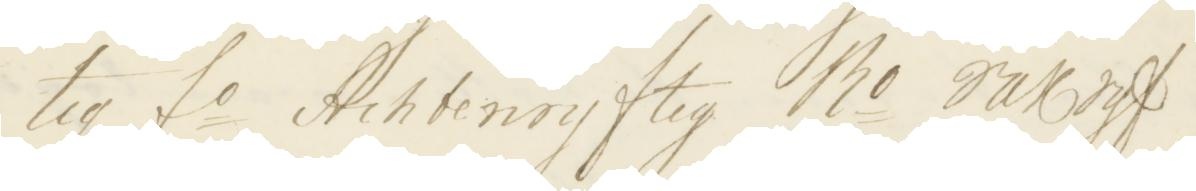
tig f=o Achtenvyftig R=o vak vyf
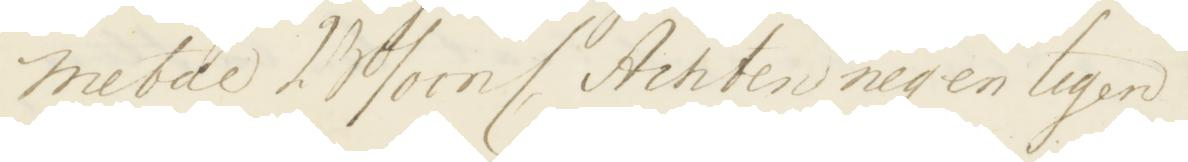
met de 23% onC. Achten negen tigen
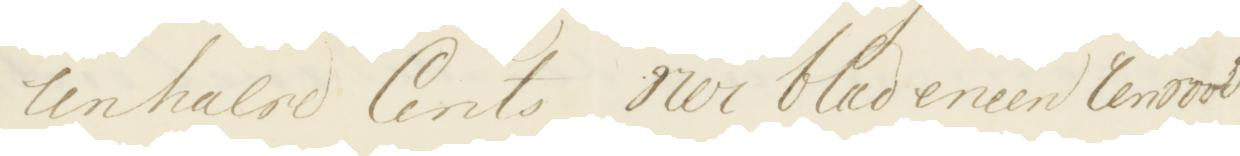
een halve Cents vier blad en een renvooi.
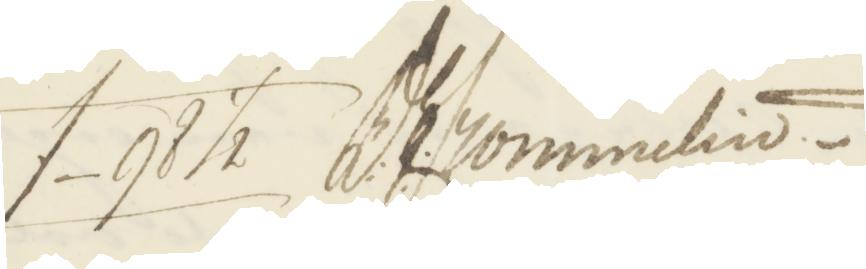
ƒ– 98½ D:F: Crommelin.
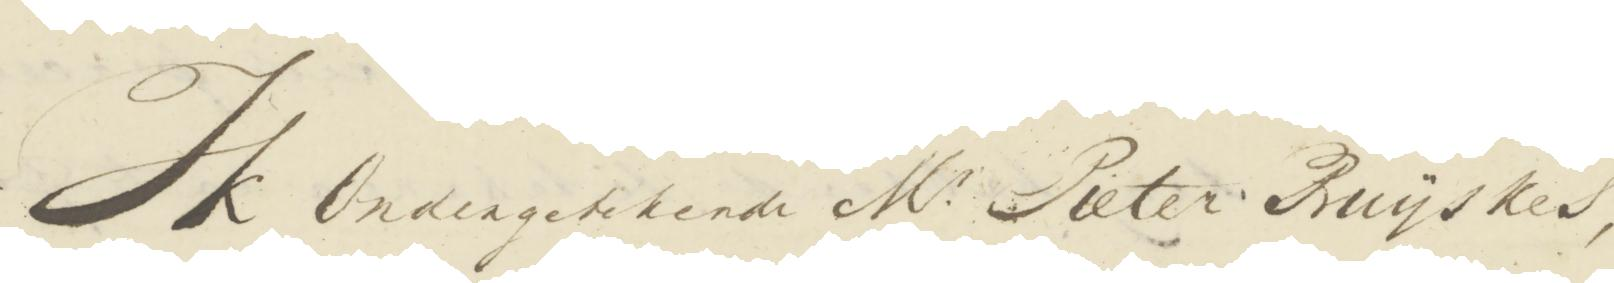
Ik Ondergetekende M.r Pieter Ruijskes,
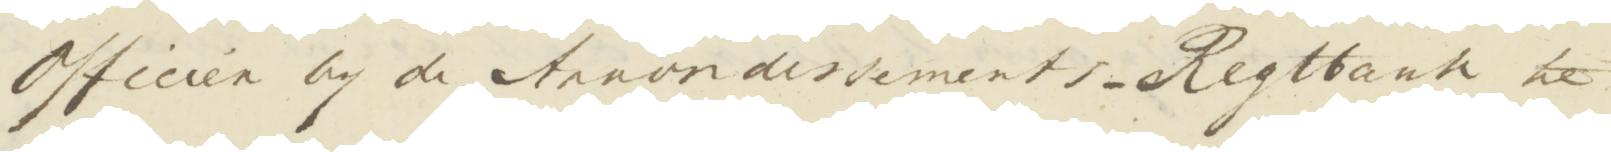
Officier by de Arrondissements-Regtbank te
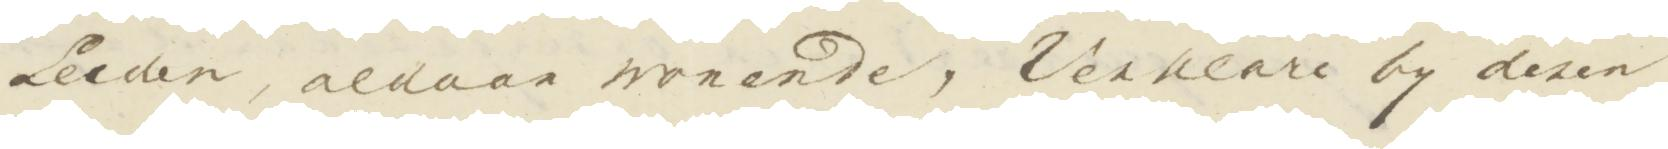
Leiden, aldaar wonende, Verklare by dezen
